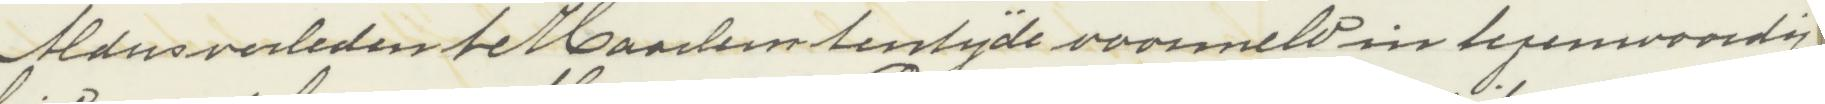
Aldus verleden te Haarlem ten tijde voormeld in tegenwoordig
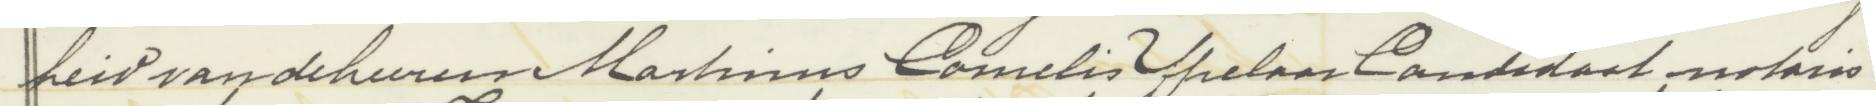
heid van de heeren Martinus Cornelis Ypelaar Candidaat notaris
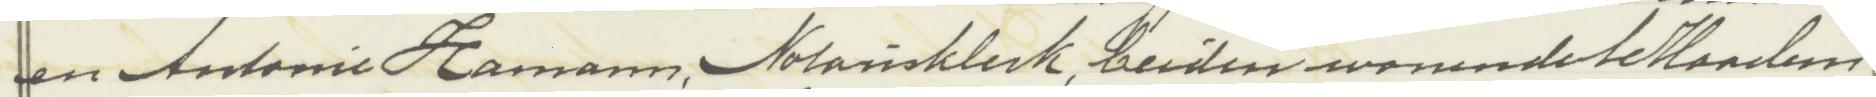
en Antonie Hamann, Notarisklerk, beiden wonende te Haarlem
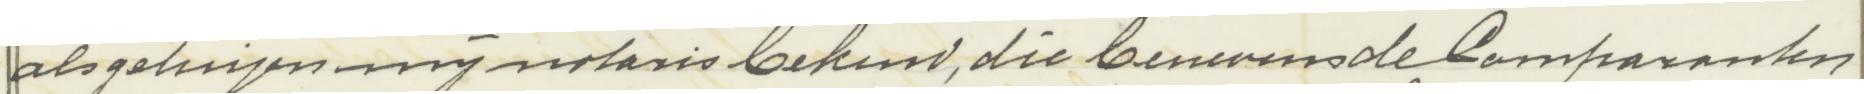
als getuigen mij notaris bekend, die benevens de Comparanten
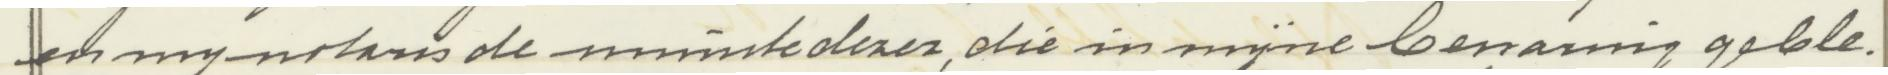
en my notaris de minute dezer, die in mijne bewaring geble„
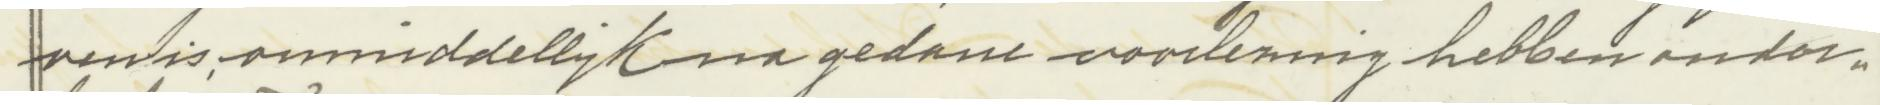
ven is, onmiddelljk na gedane voorlezing hebben onder„
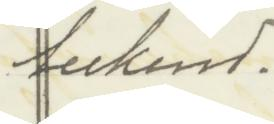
teekent.
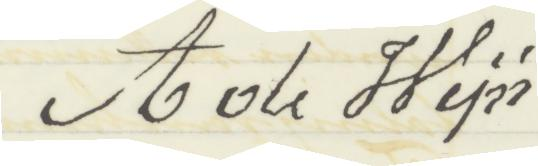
A de Wijn
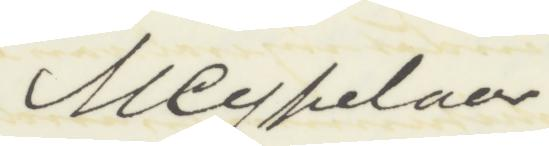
M.C.ypelaar
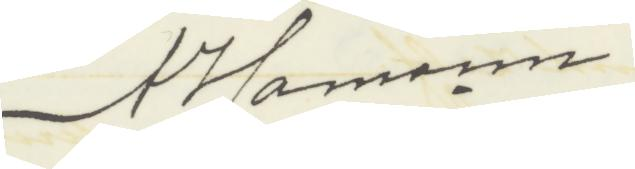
AHamann
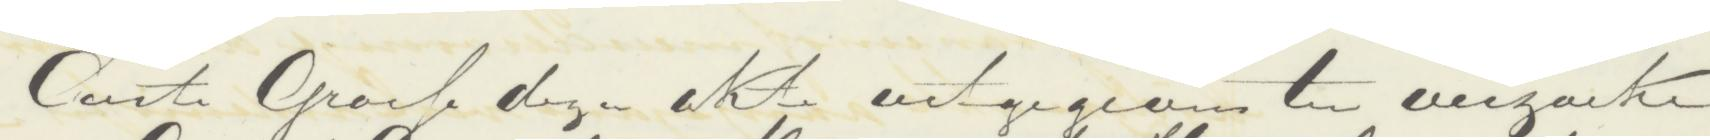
Eerste Grosse dezer akte uitgegeven ten verzoeke
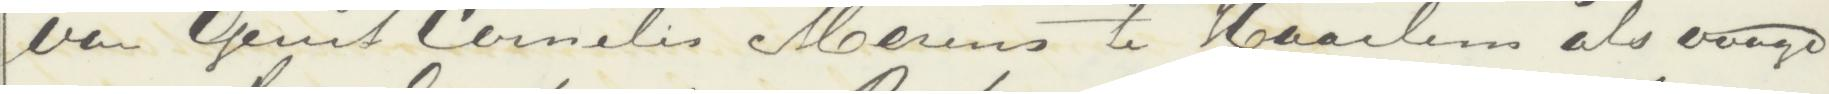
van Gerrit Cornelis Merens te Haarlem als voogd
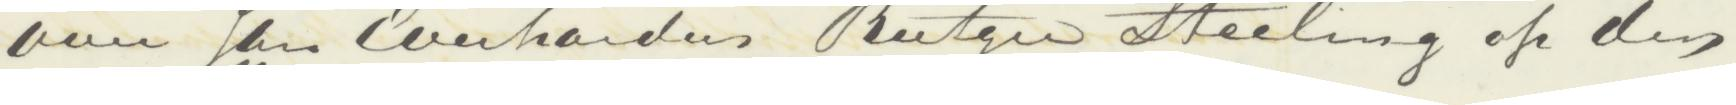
van Jan Everhardus Rutger Steeling op den
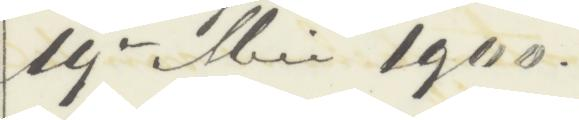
19e Mei 1900.
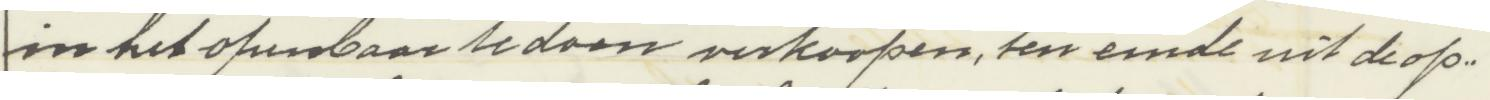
in het openbaar te doen verkoopen, ten einde uit de op„
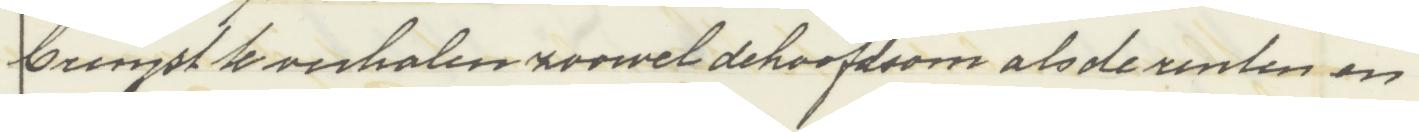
brengst te verhalen zoowel dehoofdsom als de renten en
